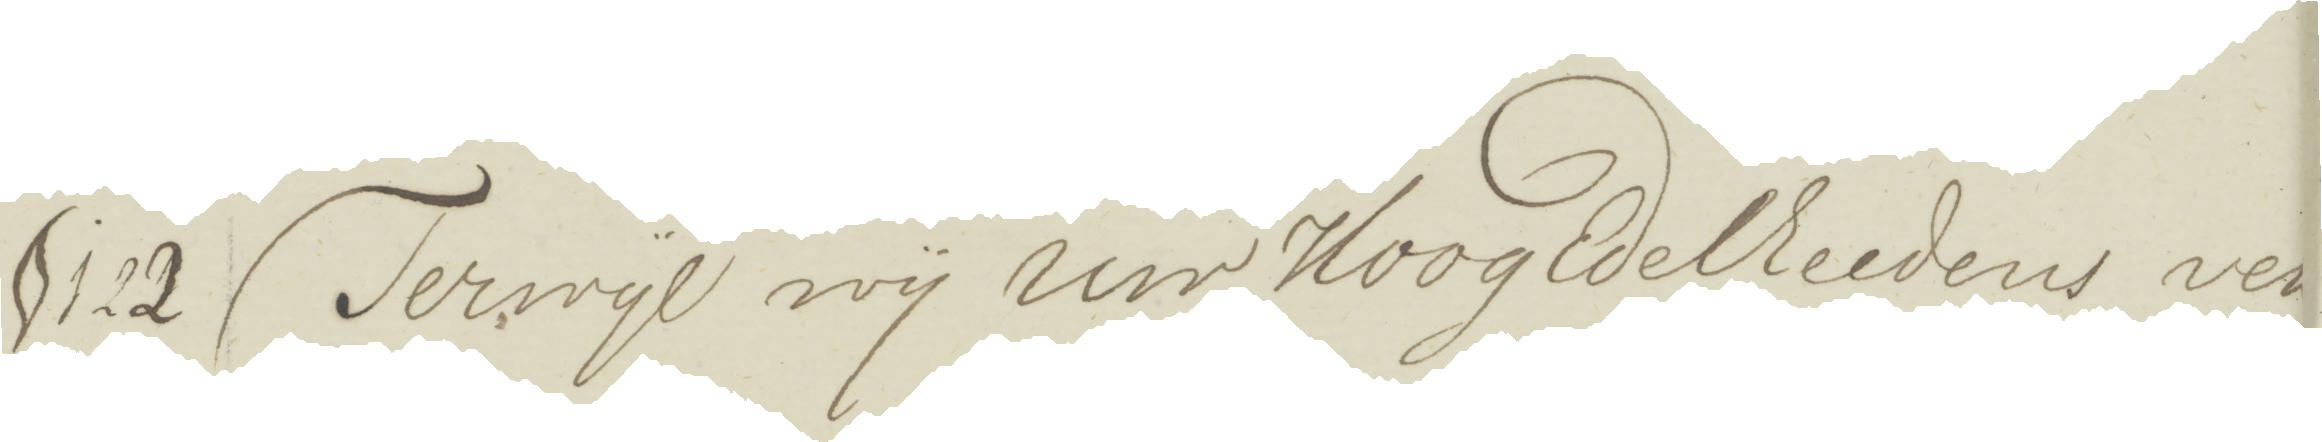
§122 Terwijl wij uw Hoog Edelheedens ver
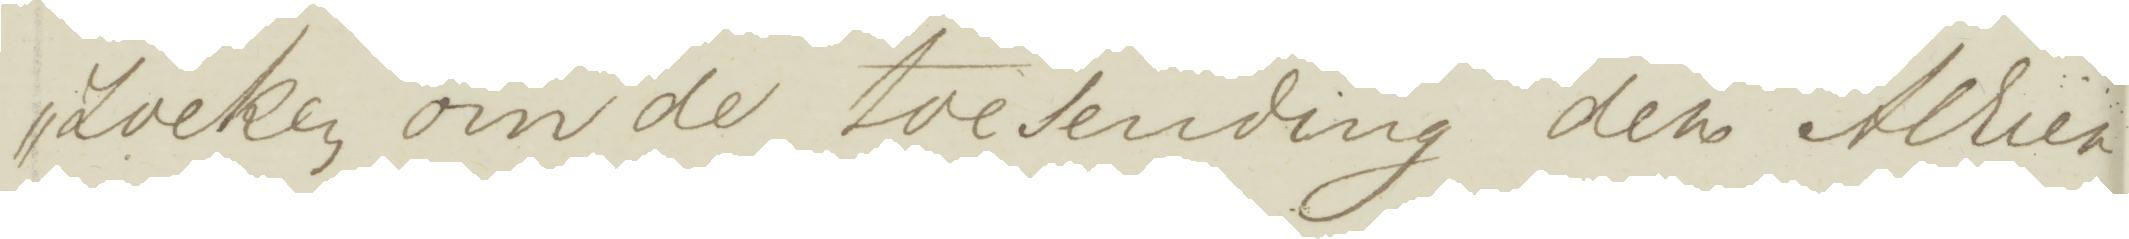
„zoeken om de toesending der Alhier
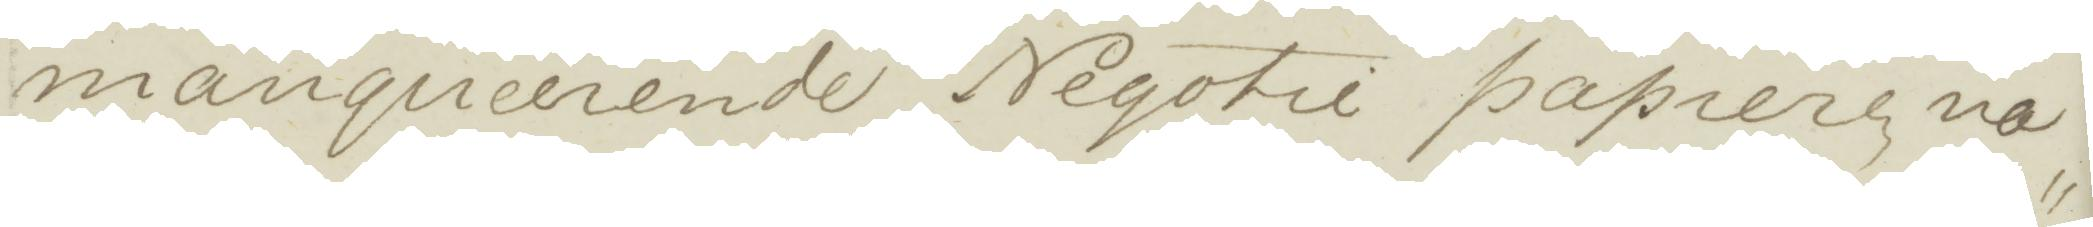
manqueerende Negotie papieren na„
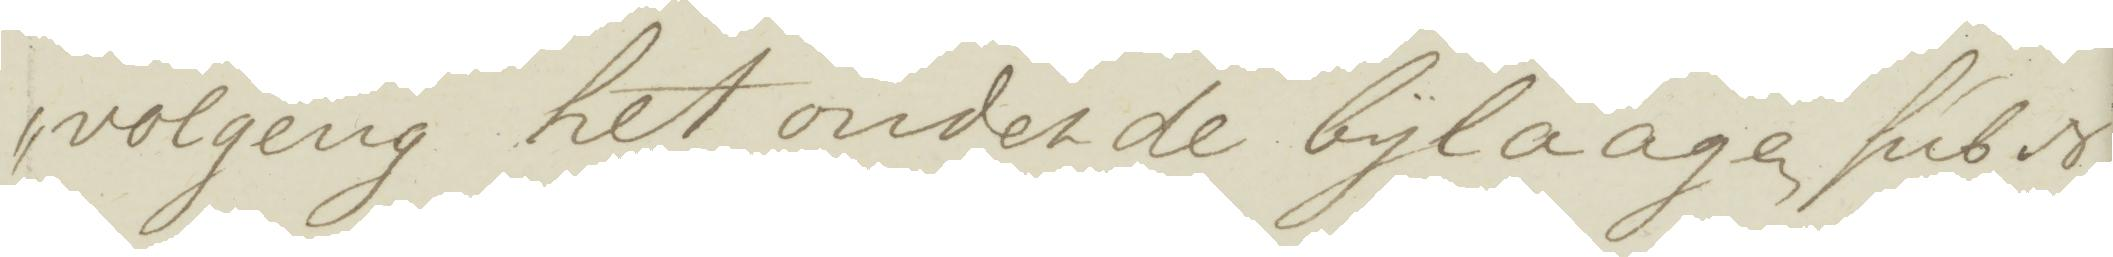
„volgeng het onder de bijlaagen sub N
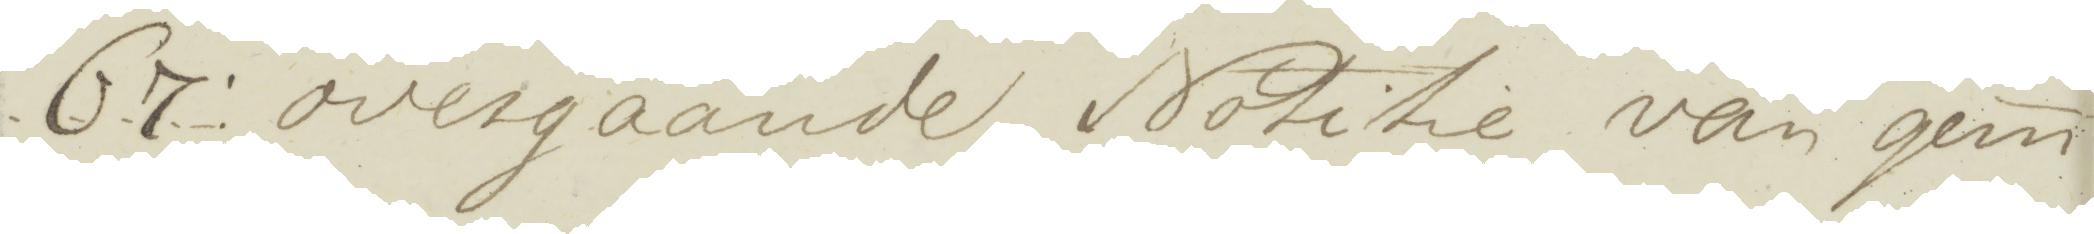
67: overgaande Notitie van gem
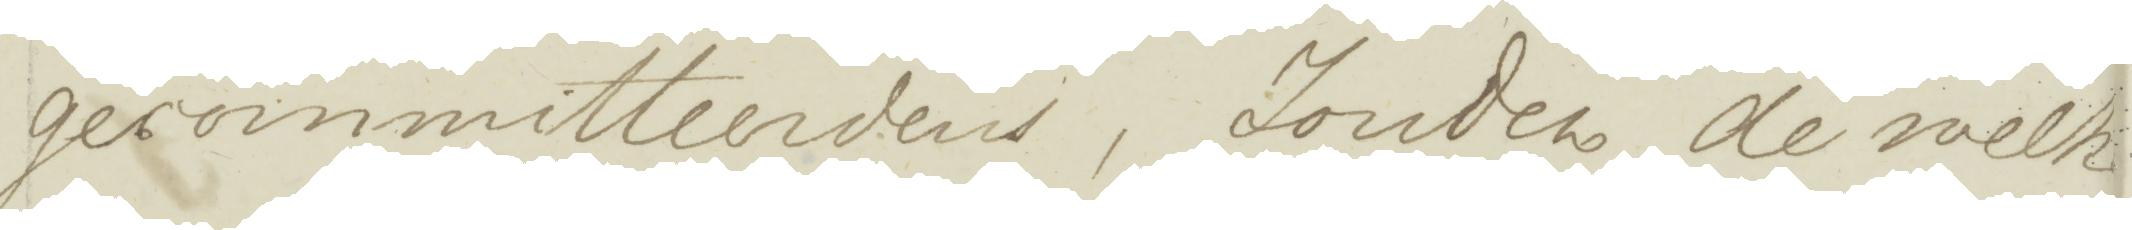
gecommitteerdens, zonder de welk
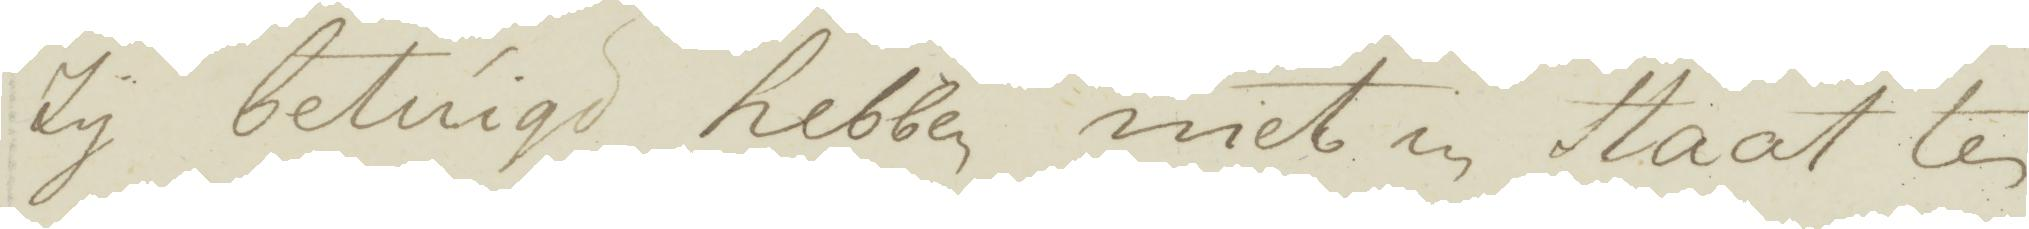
zij betuigd hebben niet in staat te
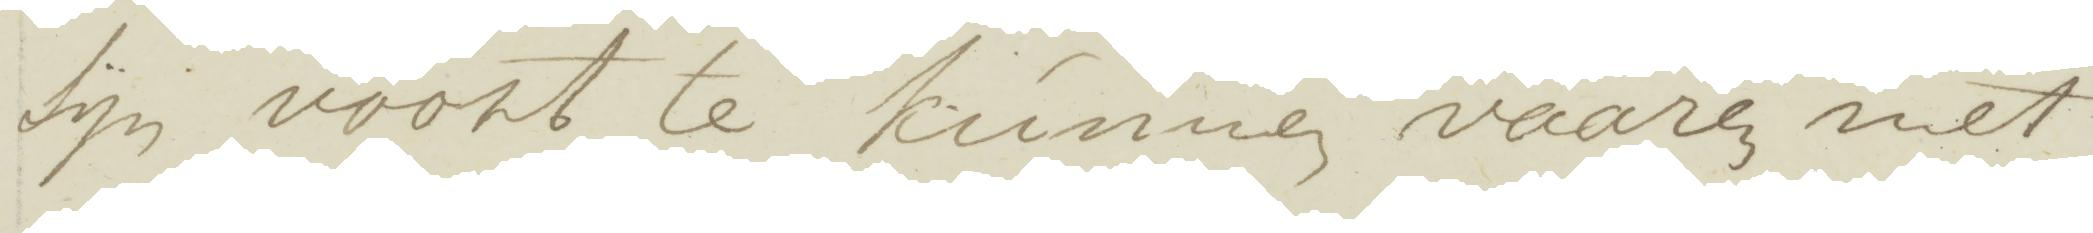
sijn voort te kunnen vaaren met
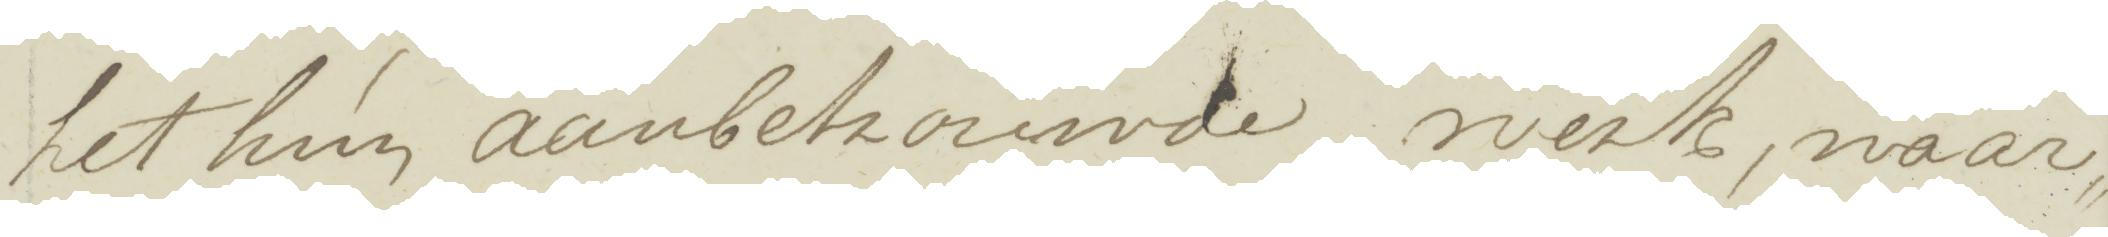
het hun aanbetrouwde werk, waar„
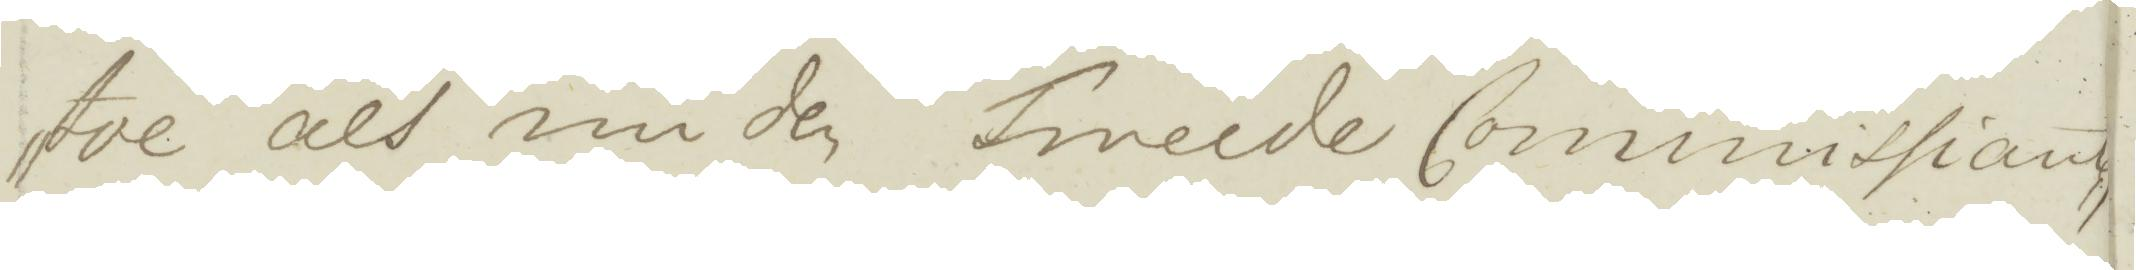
„toe als nu den Tweede Commissiant„
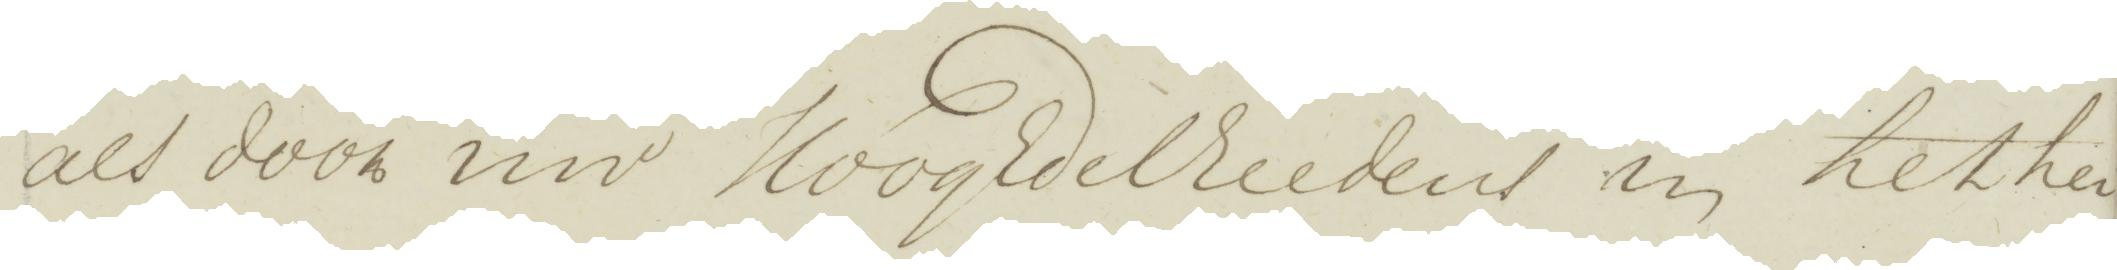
als door uw HoogEdelheedens in het hei
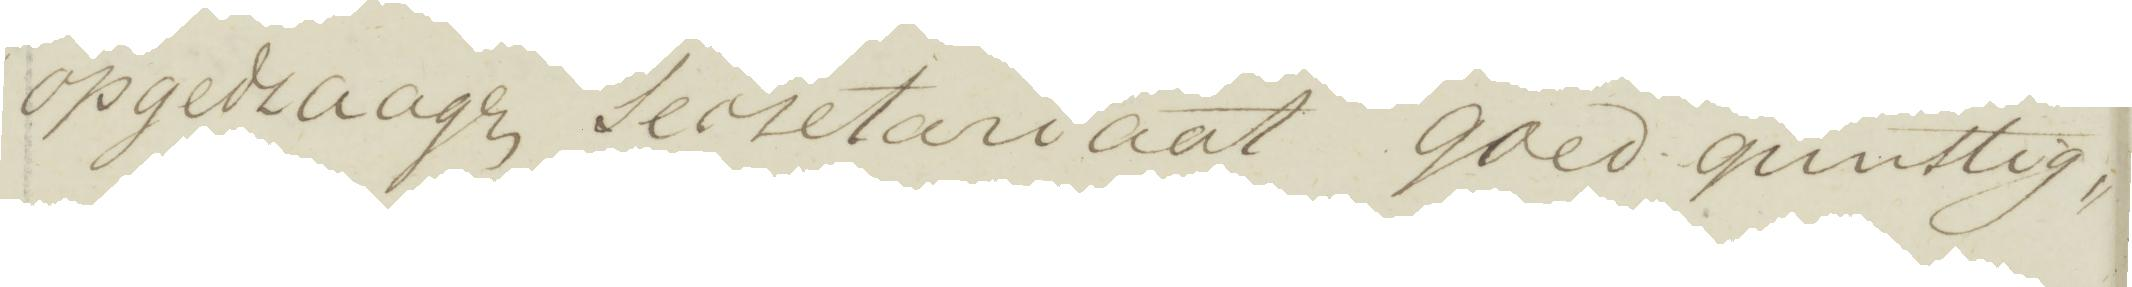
op gedraagen secretariaat goed gunstig„
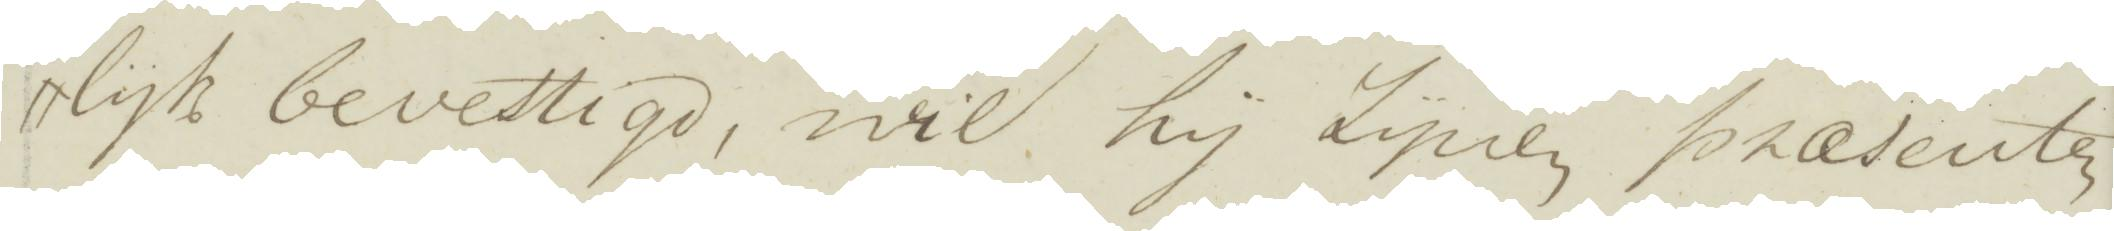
lijk bevestigd, wil hij zijnen praesenten
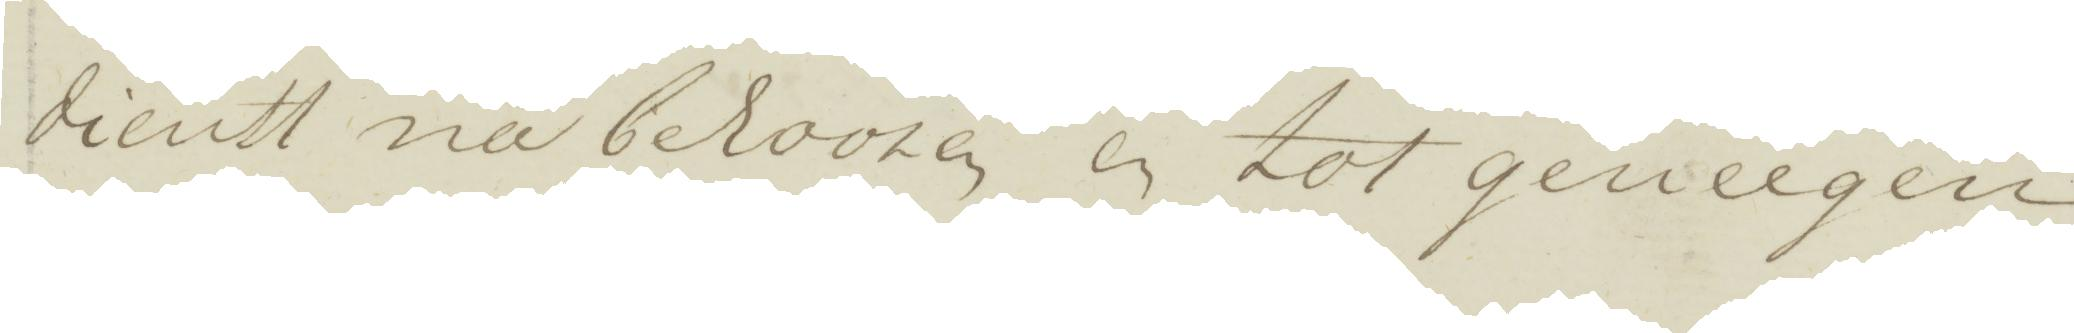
dienst na behooren en tot geneegen
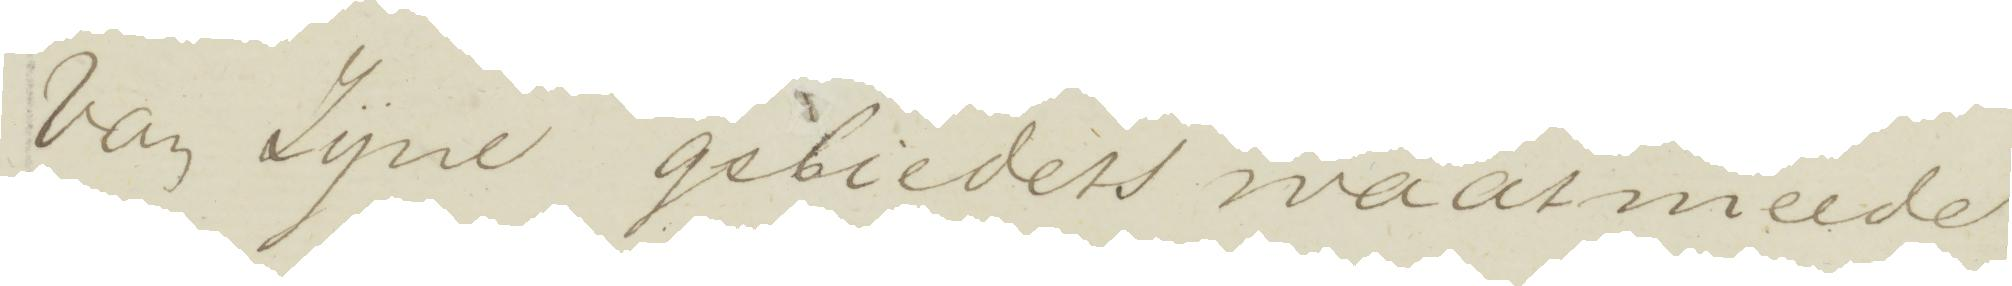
van zijne gebieders waar meede
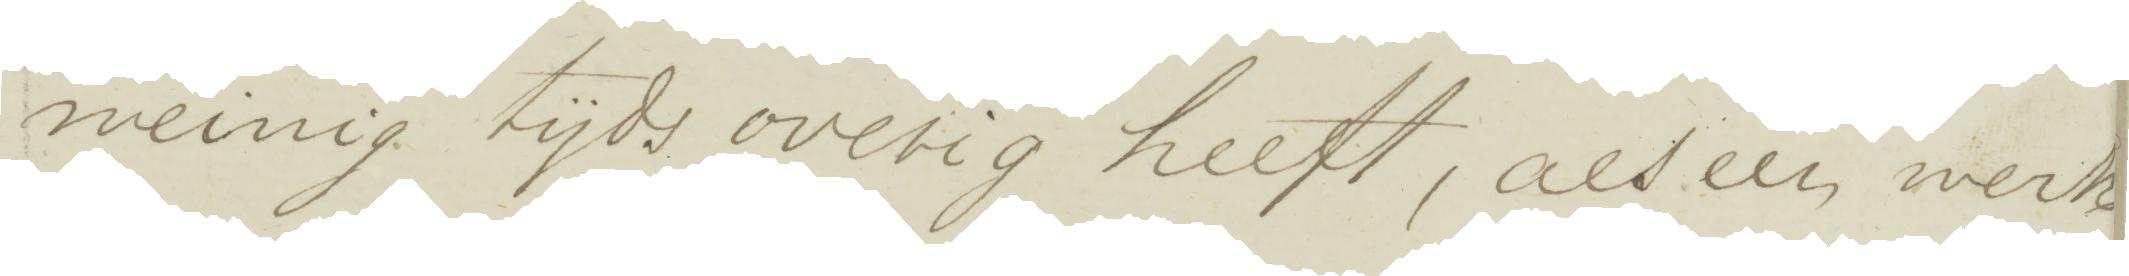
weinig tijds overig heeft, als een werk
